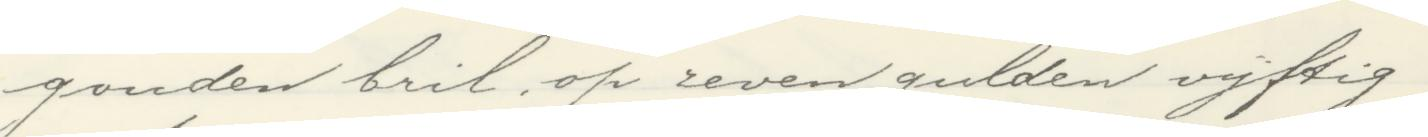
gouden bril, op zeven gulden vijftig
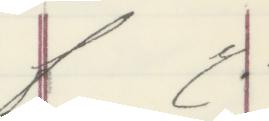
ƒ 7,
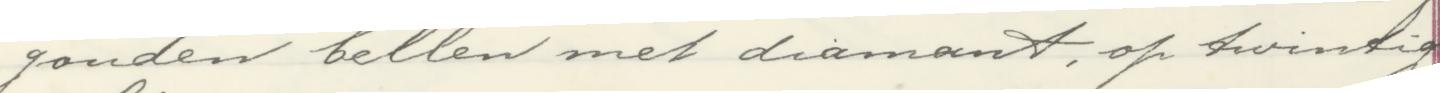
gouden bellen met diamant, op twintig
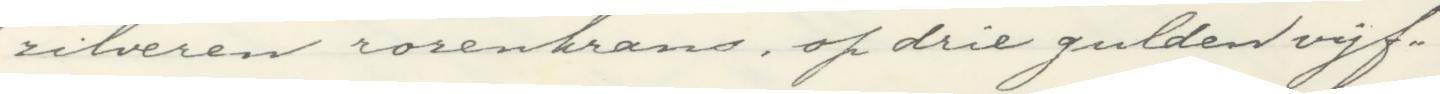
zilveren rozenkrans, op drie gulden vijf„
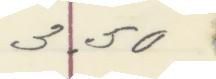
3, 50
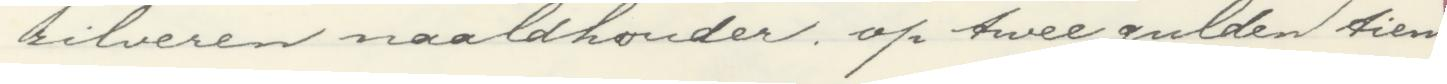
zilveren naaldhouder, op twee gulden tien
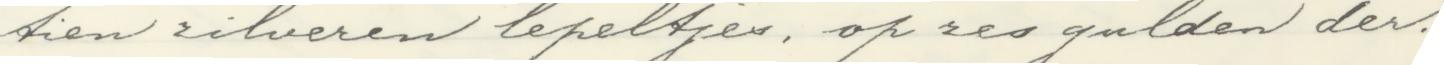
tien zilveren lepeltjes, op zes gulden der„
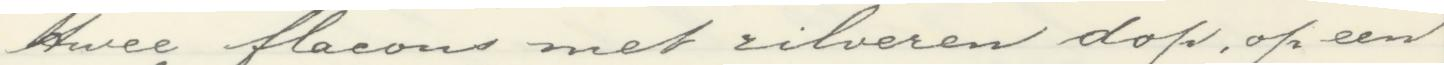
twee flacons met zilveren dop, op een
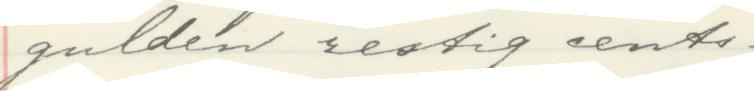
gulden zestig cents
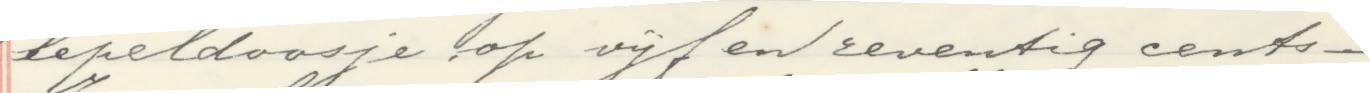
lepeldoosje op vijf en zeventig cents
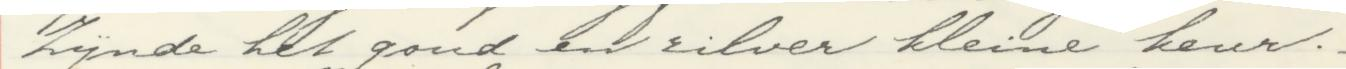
Zijnde het goud en zilver kleine keur.
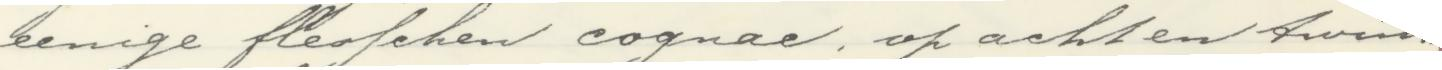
eenige flesschen cognac, op acht en twin„
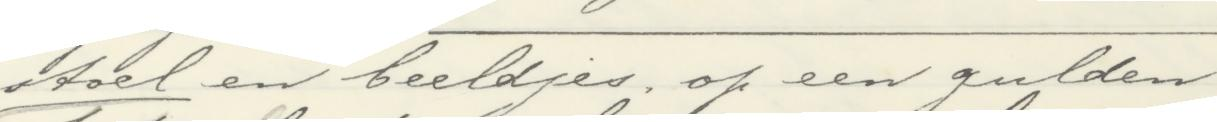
stoel en beeldjes, op een gulden
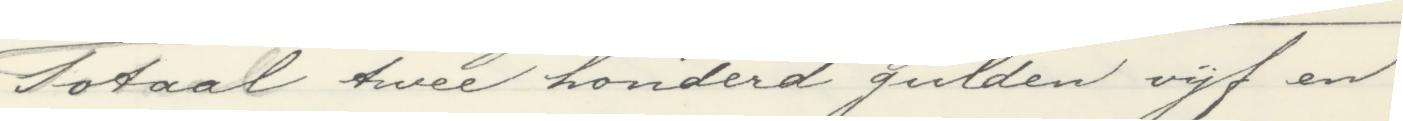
Totaal twee honderd gulden vijf en
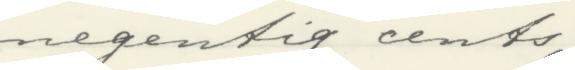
negentig cents
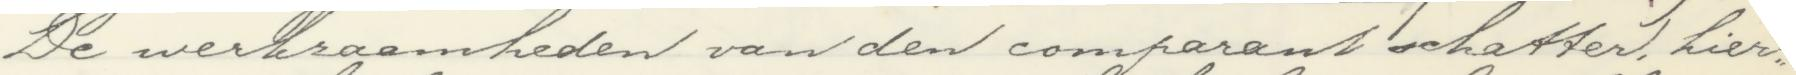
De werkzaamheden van den comparant schatter, hier„
